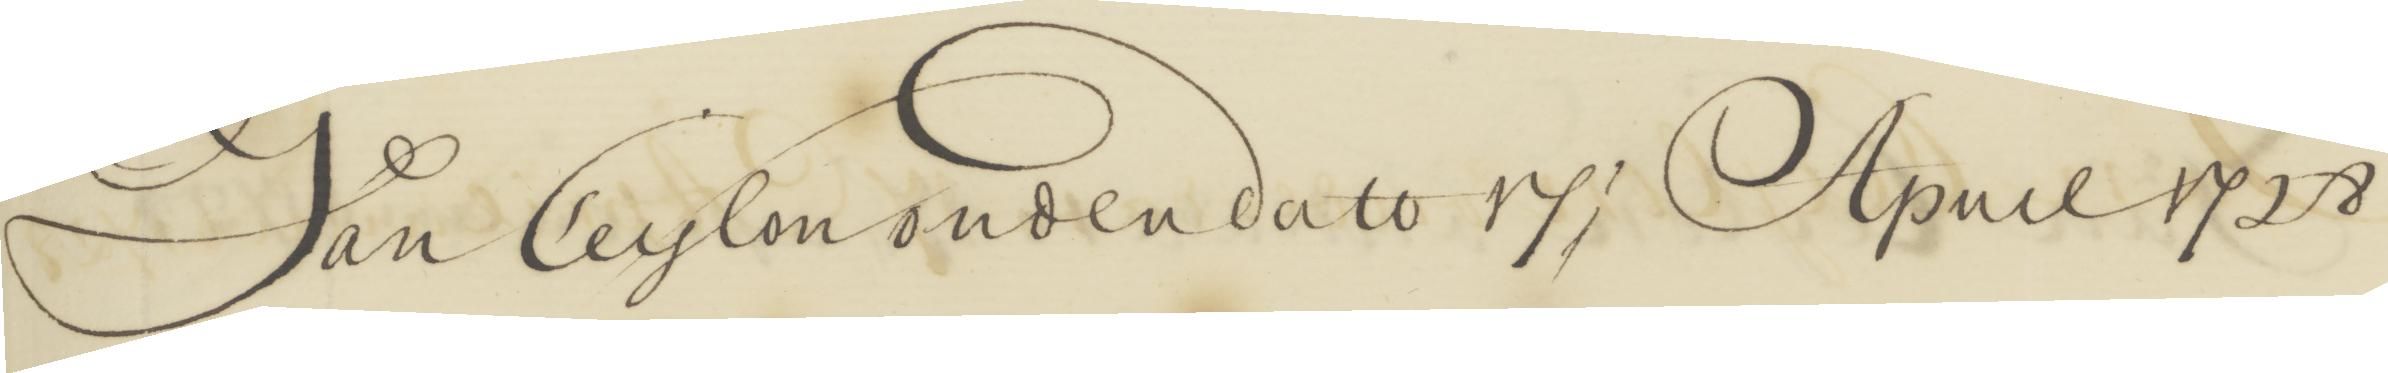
Van Ceylon onder dato 17„' April 1728
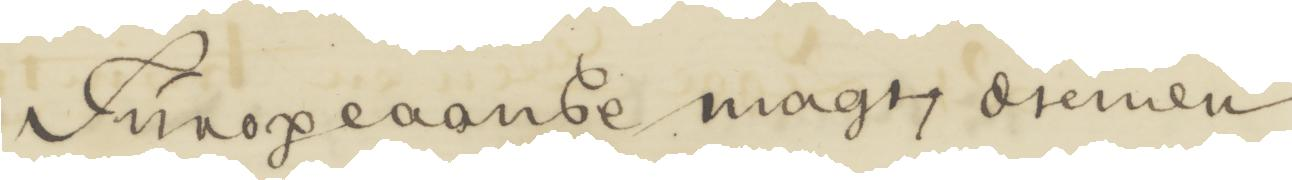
Europeaanse magts diemen
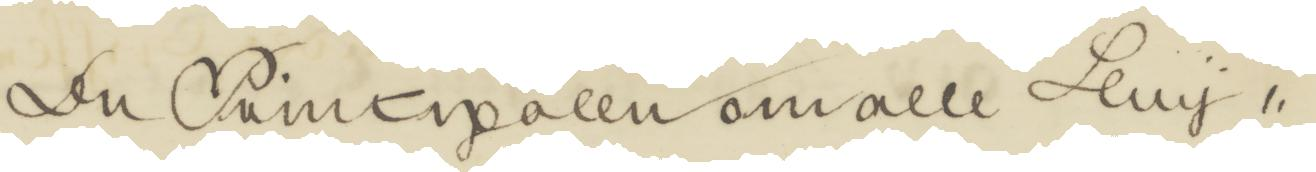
ten Principalen om alle sluij„
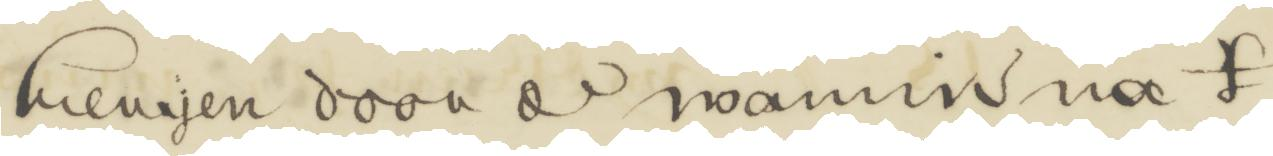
kerijen door de wannie na 't
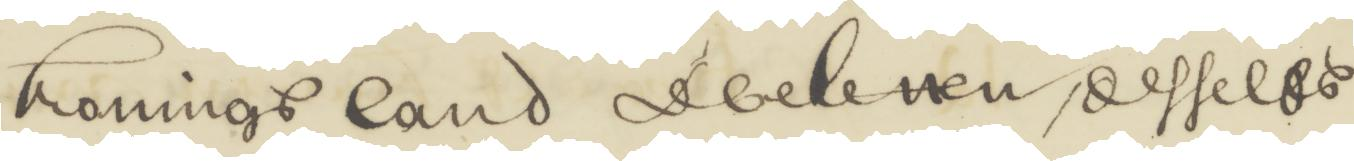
konings land te beletten, desselfs
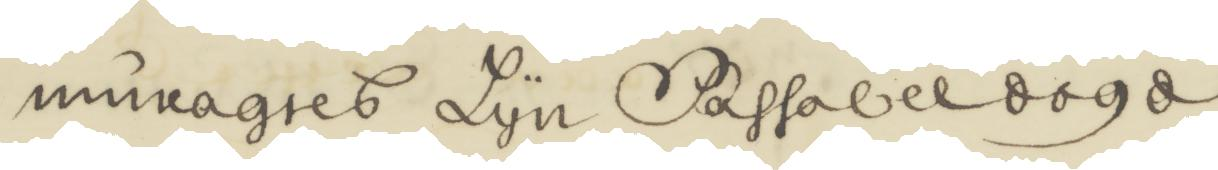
muragies zijn Passabel dog de
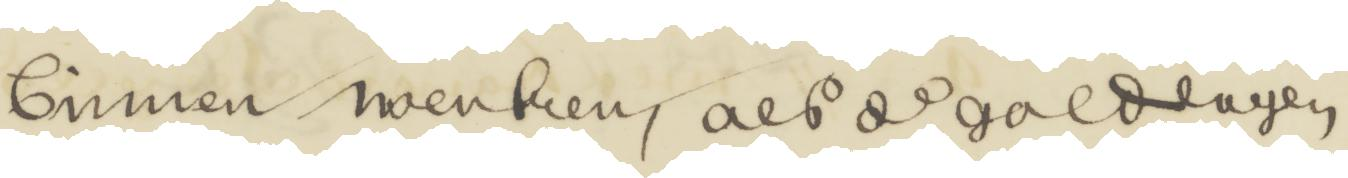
binnen werken, als de galderijen
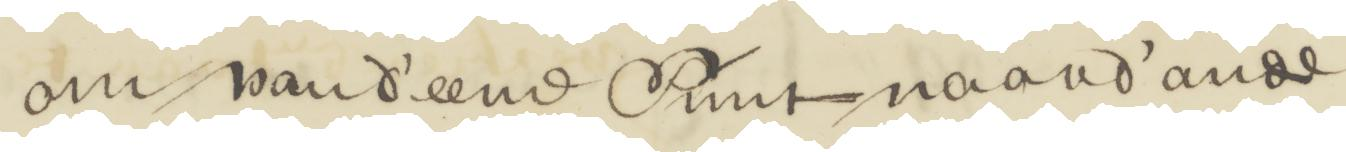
om van d’ eene Punt naard' ande
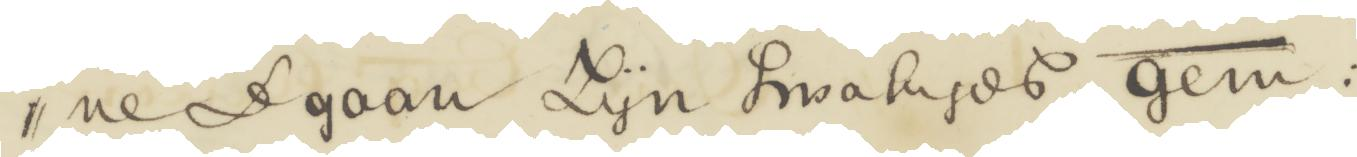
„re te gaan zijn swakjes, gem:
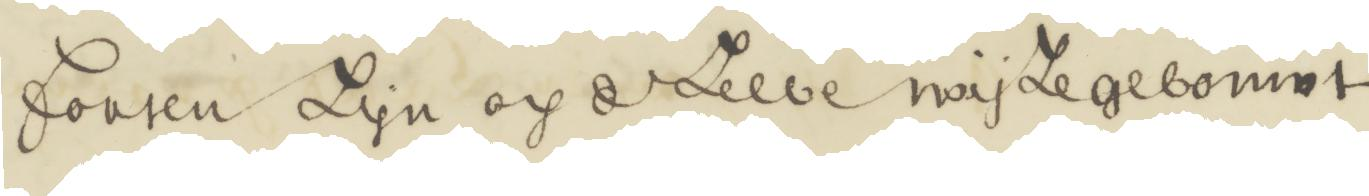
forten zijn op deselve wijze gebouwt
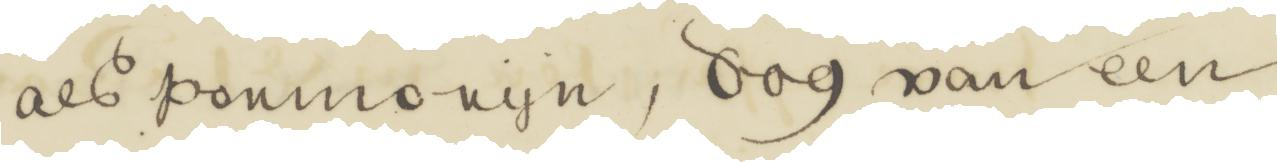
als pormorijn, dog van een
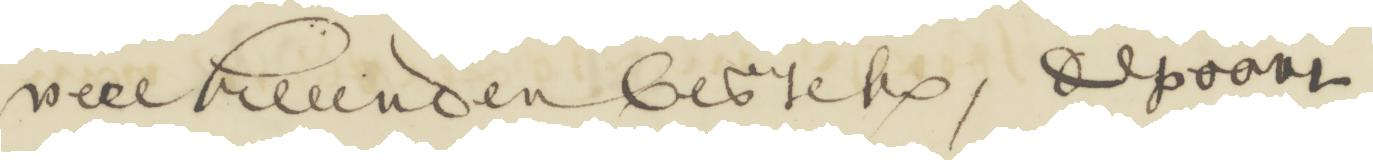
veel kleender bestek, de poort
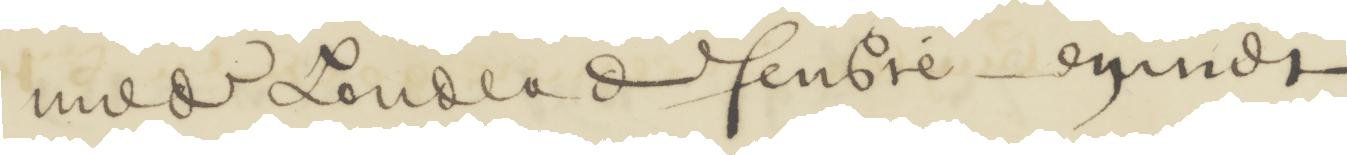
mede zonder defensie enmet
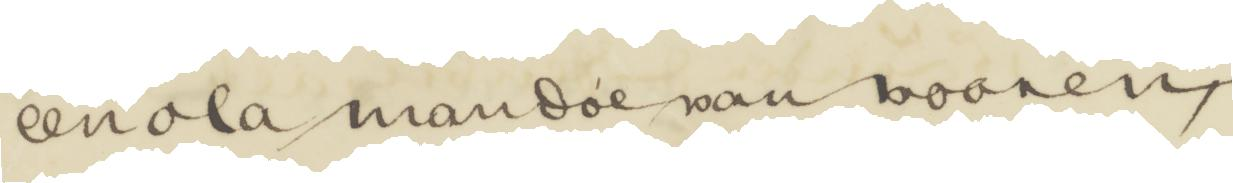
een ola mandoe van vooren,
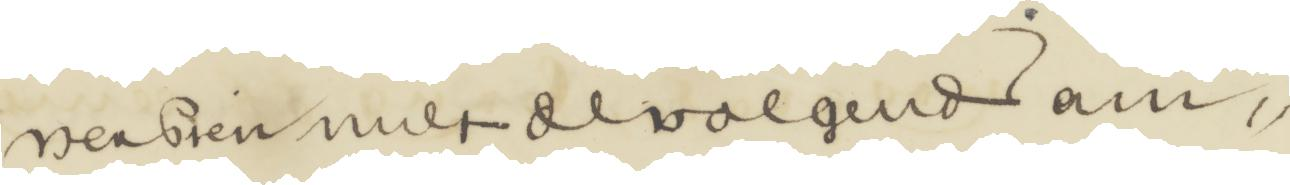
versien met de volgende am„
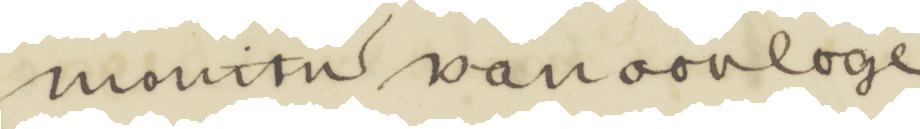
monitie van oorloge
